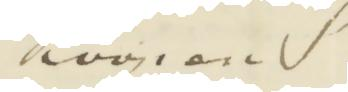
Koopens
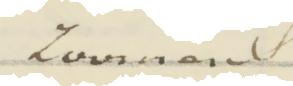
Loomans
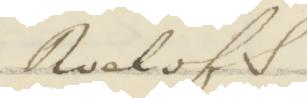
Roelofs
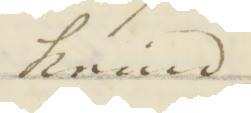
kruid
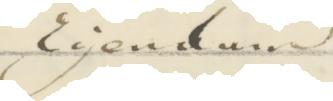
rijendam
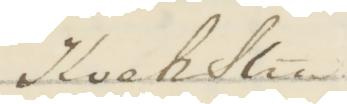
Hoekstra
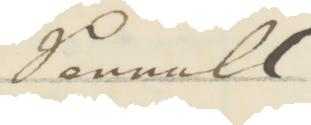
Verralt
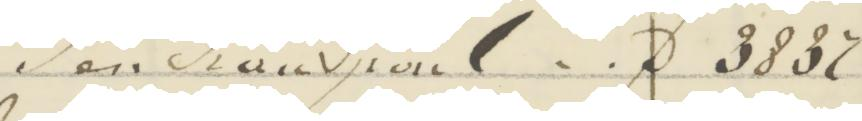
Per Transport . . ƒ 3837
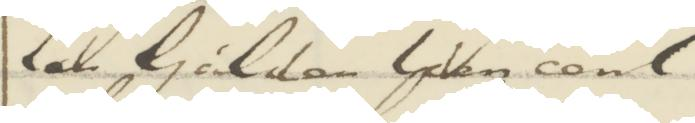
Een gulden tien cent
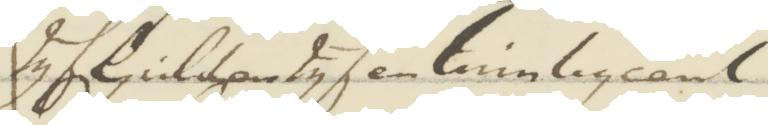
Vijf Gulden vyfentwintig cent
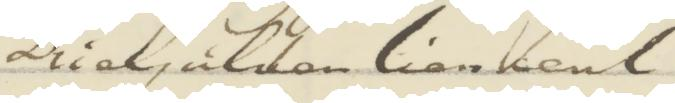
Drie gulden tien cent
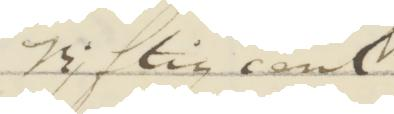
Vijftig cent
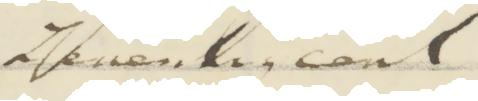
zeventig cent
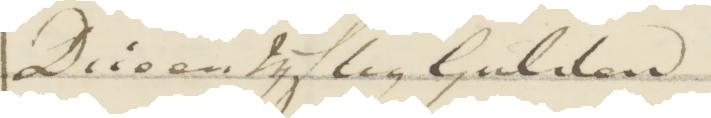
Drieenvyftig Gulden
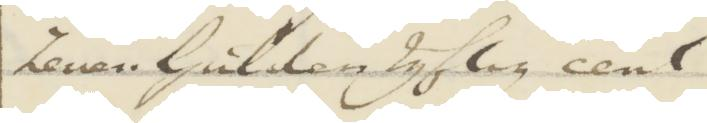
Zeven Gulden vyftig cent
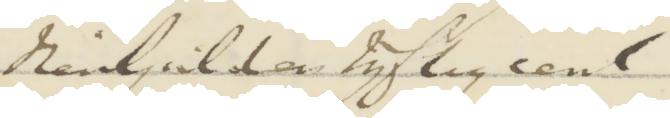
Vier Gulden vijftig cent
